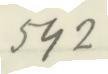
542
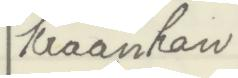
kraankan
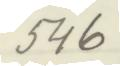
546
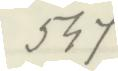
547
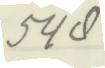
548
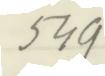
549
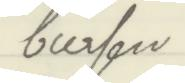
bussen
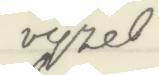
vyzel
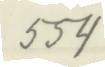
554
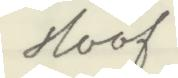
stoof
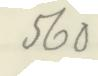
560
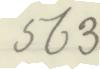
563
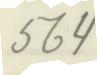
564
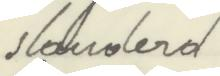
standerd
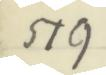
519
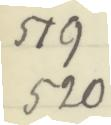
520
